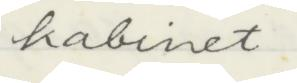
kabinet
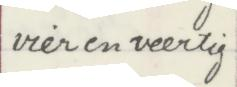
vier en veertig
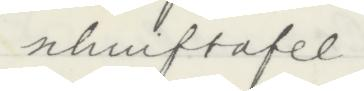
schuiftafel
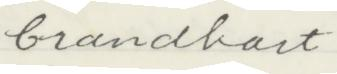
brandkast
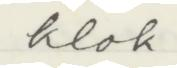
klok
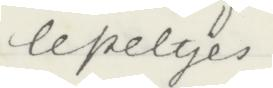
lepeltjes
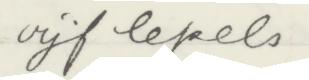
vijf lepels
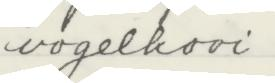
vogelkooi
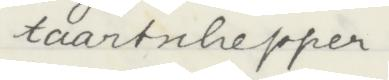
taartschepper
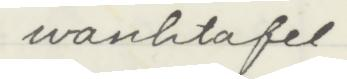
waschtafel
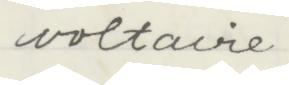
voltaire
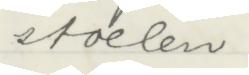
stoelen
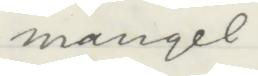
mangel
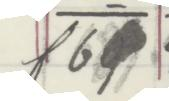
ƒ69
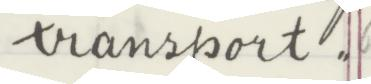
Transport „
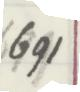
691
